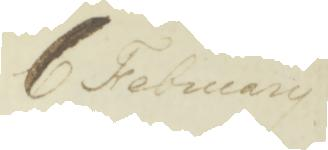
6 February
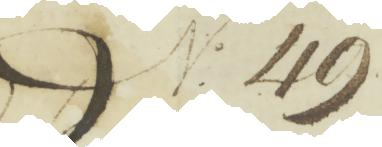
N.o 49.
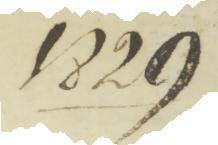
1829
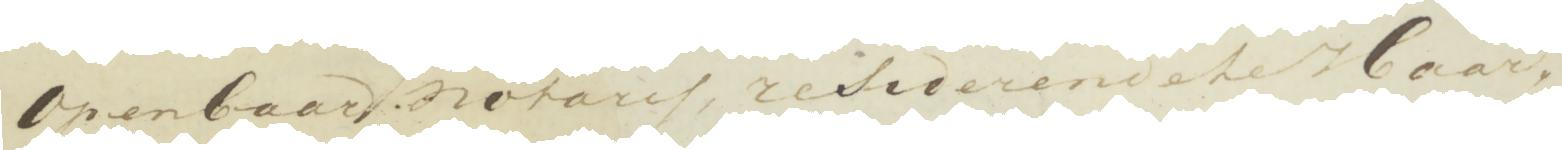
Openbaar notaris, residerende te Haar„
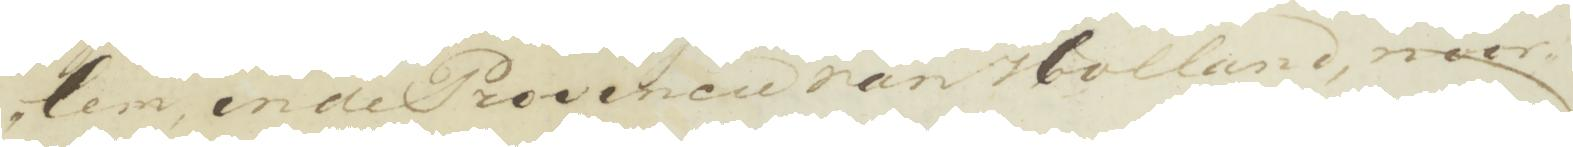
„lem, in de Provincie van Holland, noor„
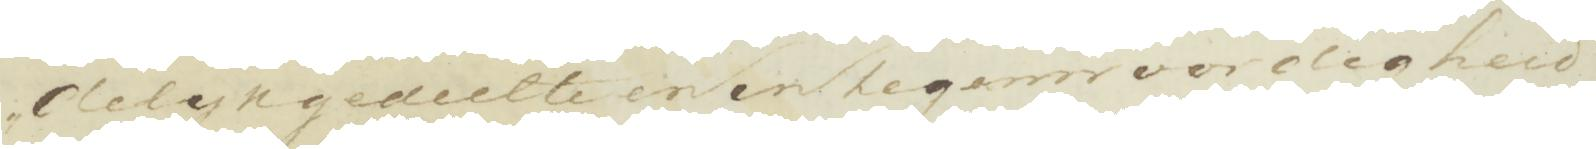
„delijk gedeelte en in tegenwoordigheid
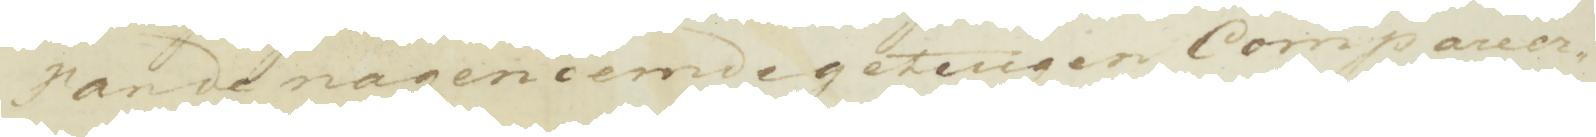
van de nagenoemde getuigen Compareer„
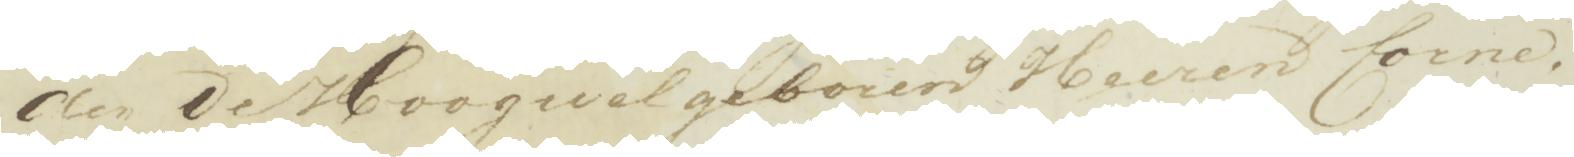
den de Hoogwelgeboren Heeren Corne,
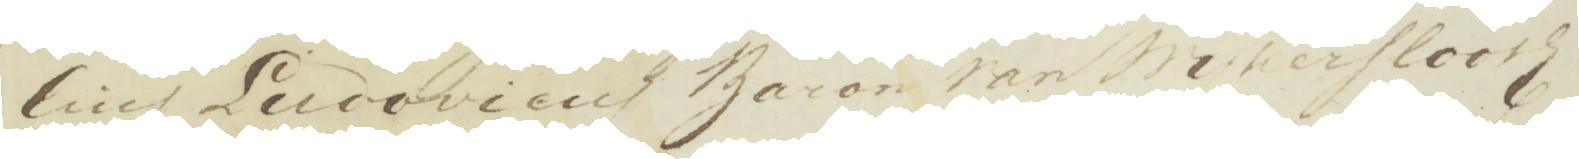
lius Ludovicus Baron van Wykerslooth
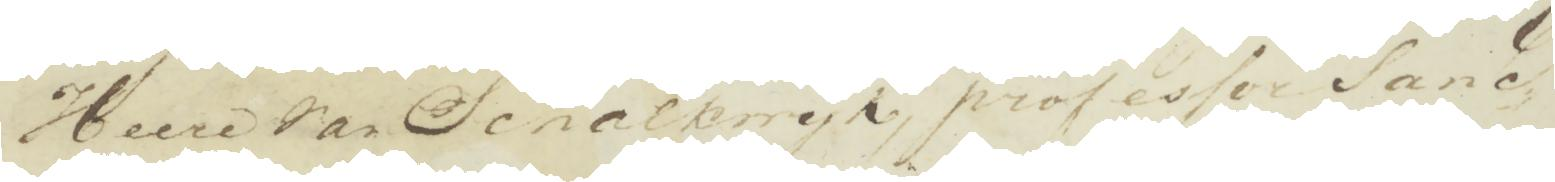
Heere van Schalkwijk, professor Sanc„
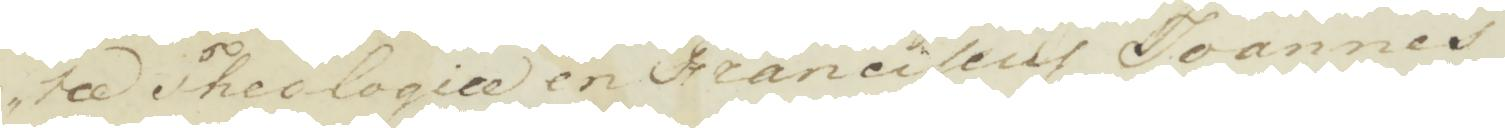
„tee Theologiae en Franciscus Joannes
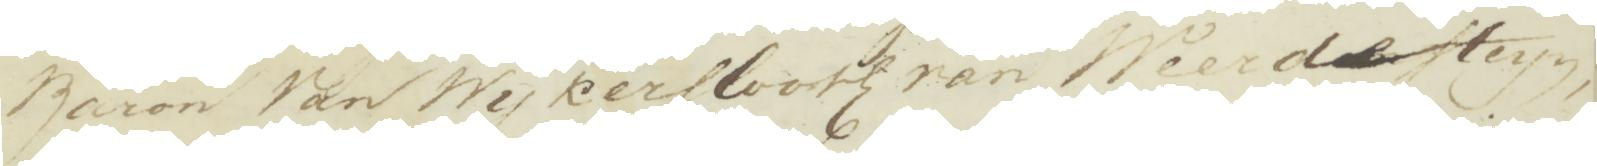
Baron van Wijkerslooth van Weerdesteyn,
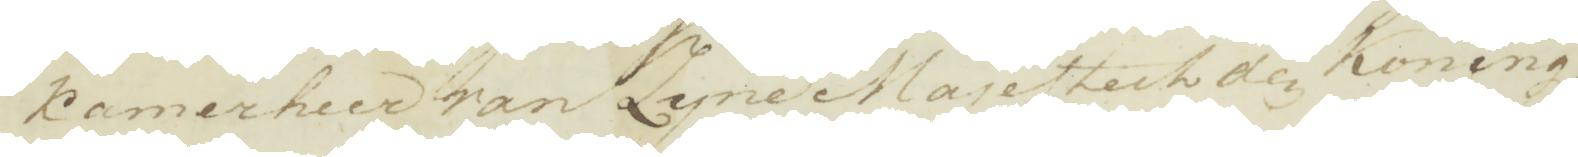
kamerheer van Zyne Majesteit de Koning
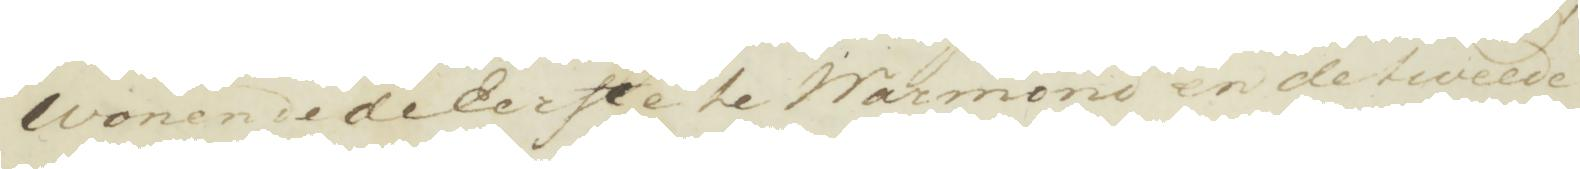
wonende de Eerste te Warmond en de tweede
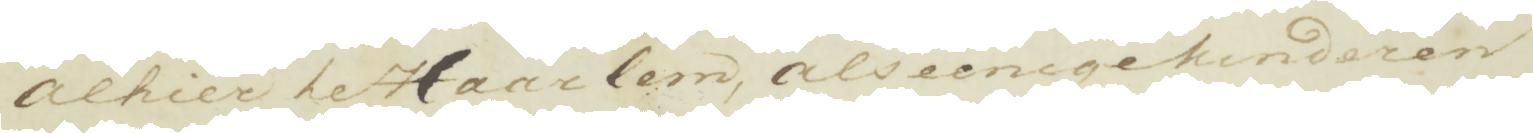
alhier te Haarlem, als eenige kinderen
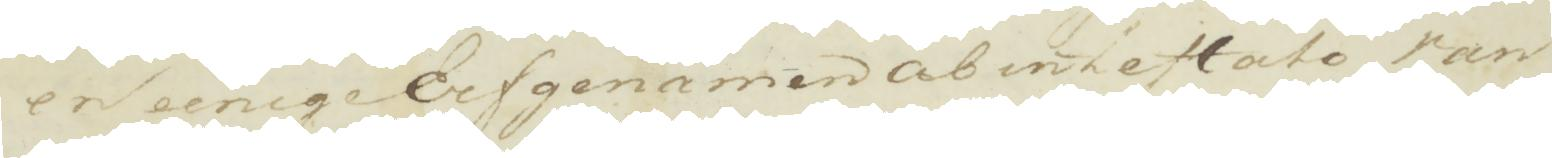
en eenige Erfgenamen ab intestato van
